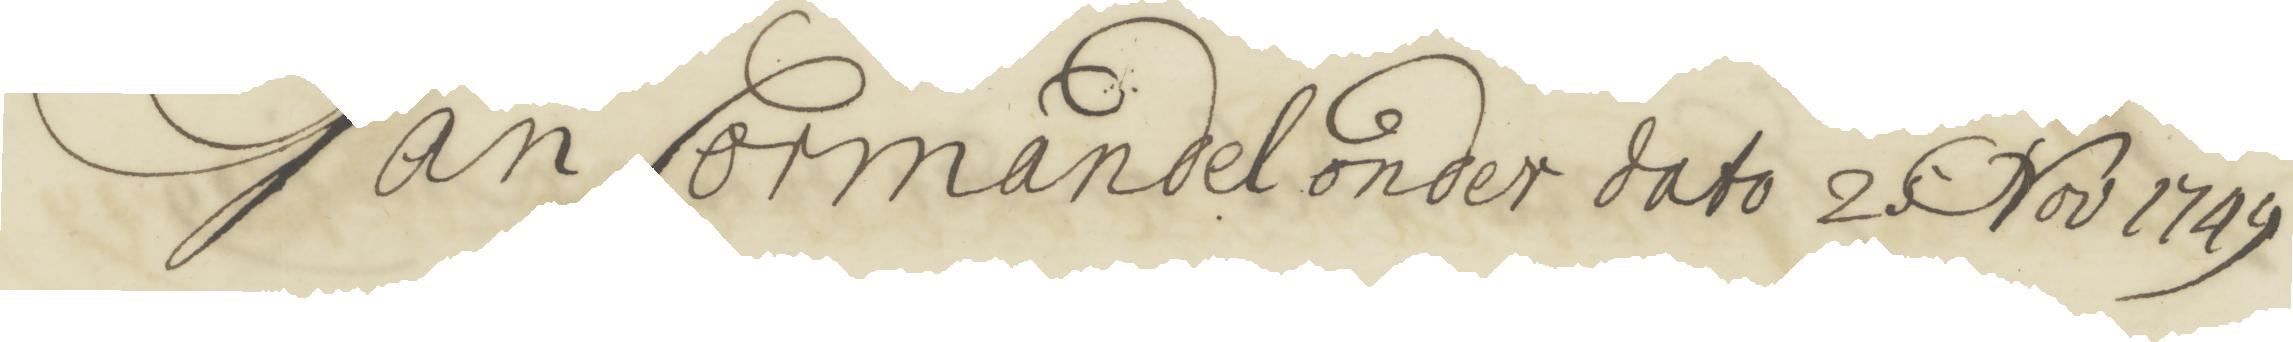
Van Cormandel onder dato 25 Nov 1749
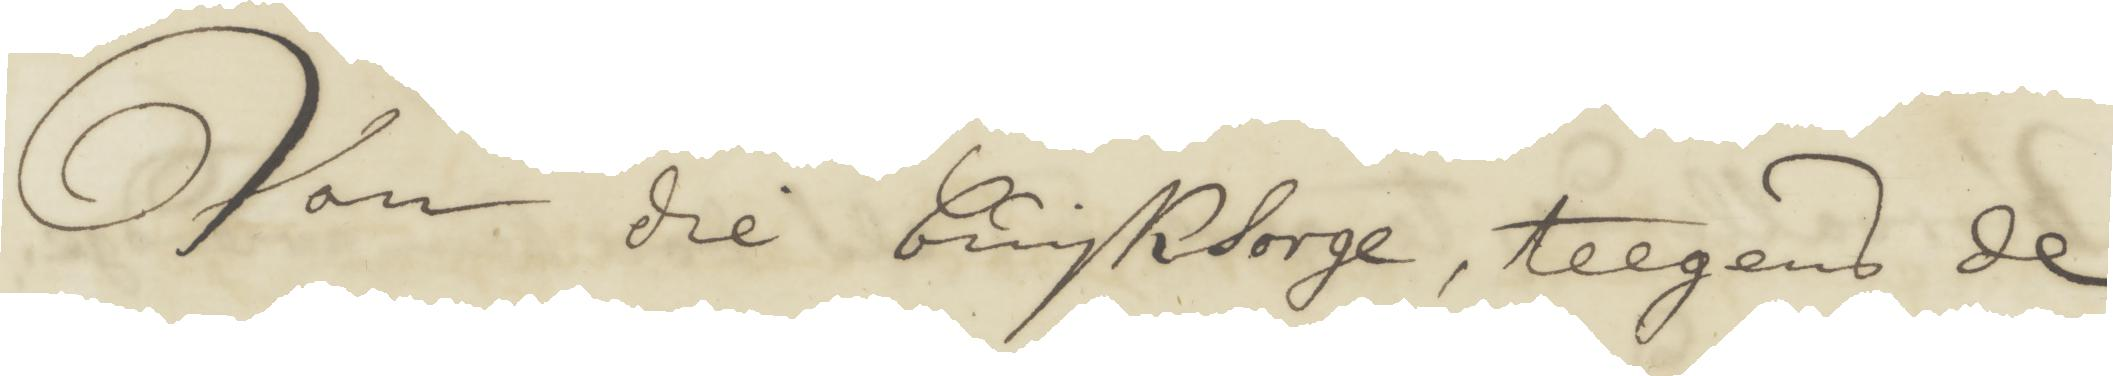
Van die buijksorge, teegens de
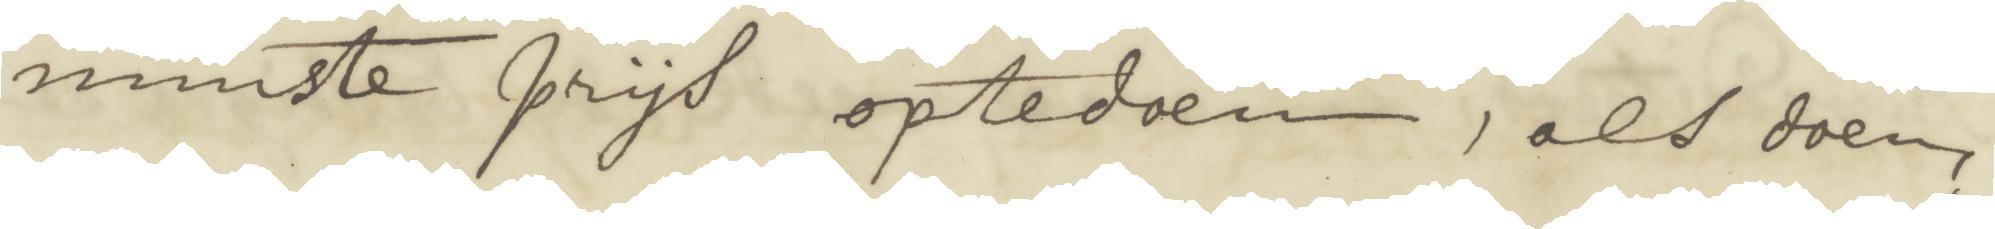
minste prijs optedoen, als doen„
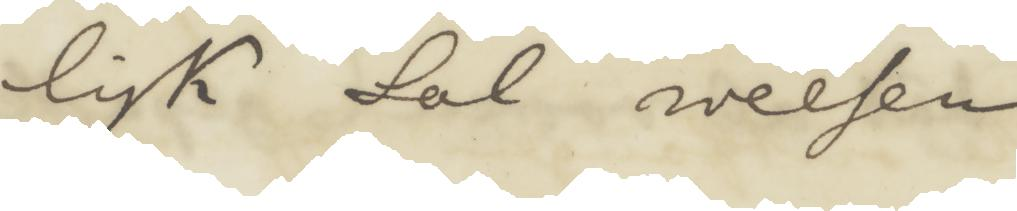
lijk sal weesen
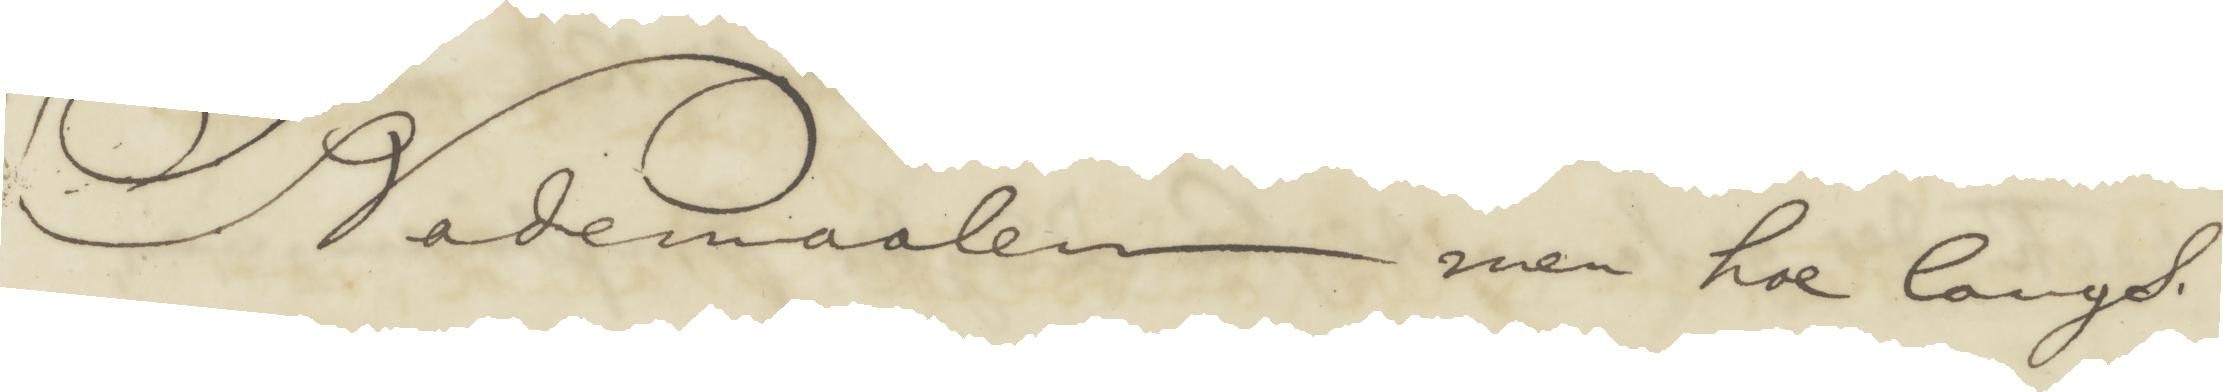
Nademaalen men hoe langs
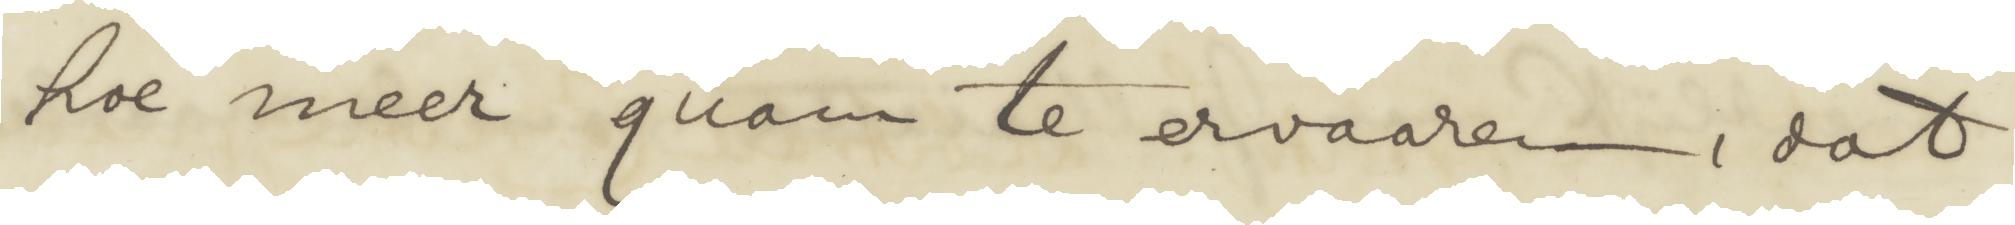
hoe meer quam te ervaaren, dat
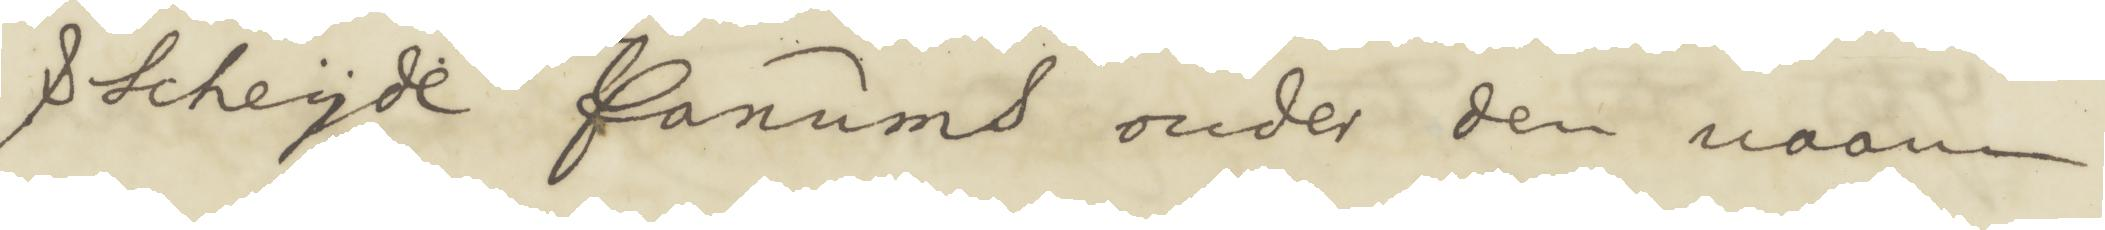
verscheijde fanums onder den naam
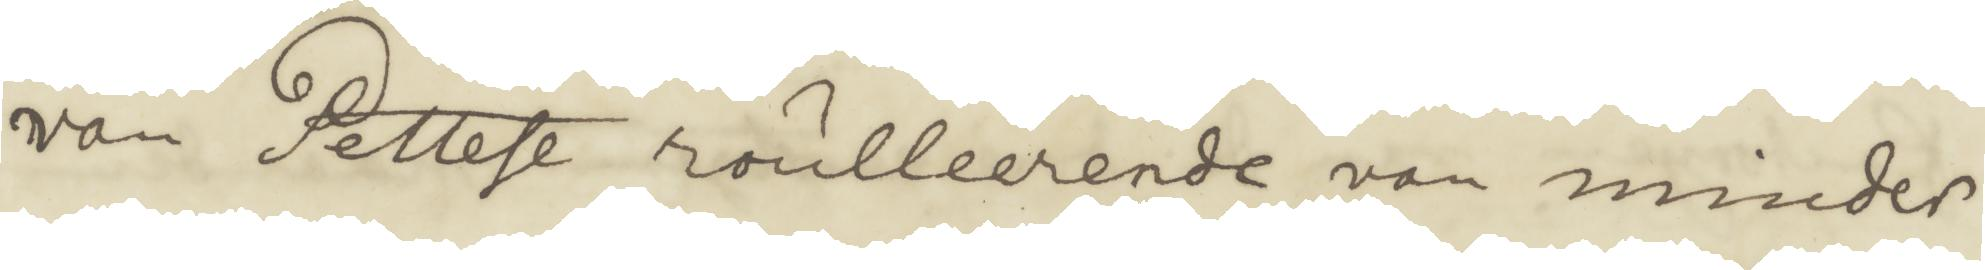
van Pettese roulleerende van minder
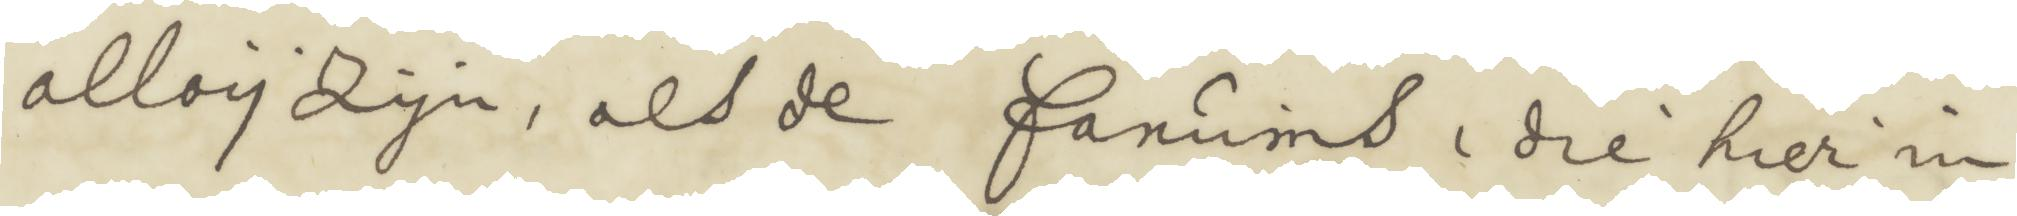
alloij zijn, als de fanums, die hier in
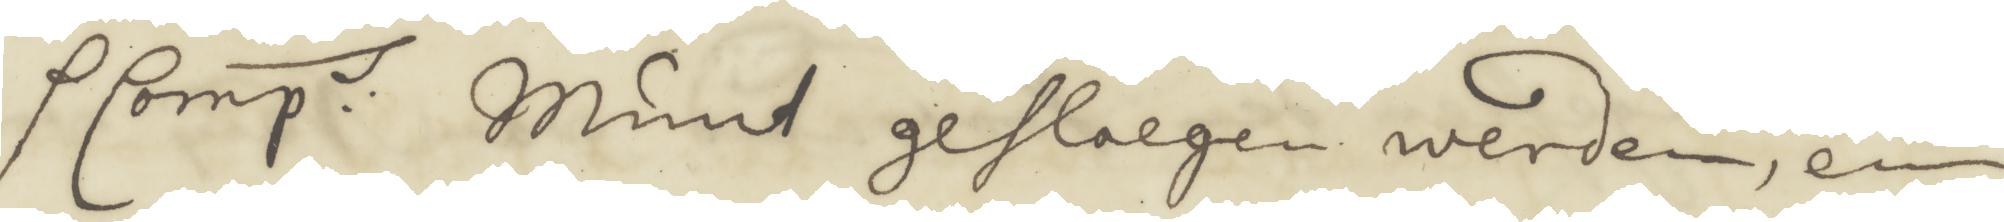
sComp:s munt geslaegen werden, en
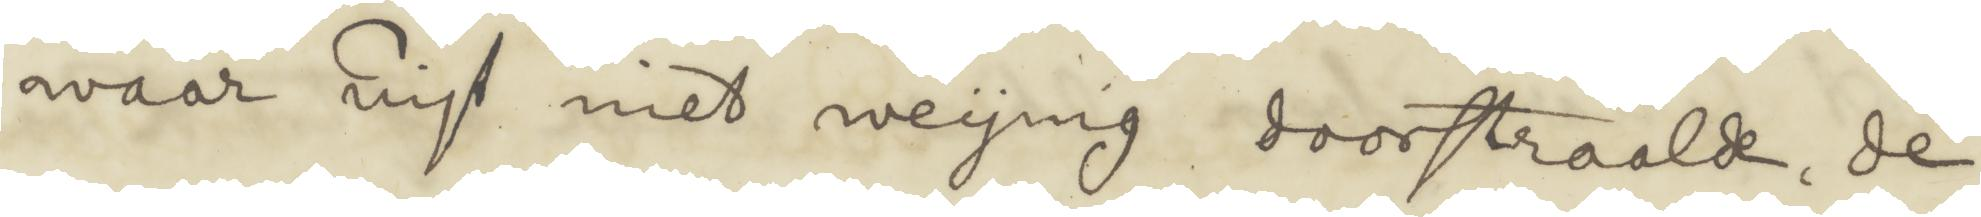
waar uijt niet weijnig doorstraalde, de
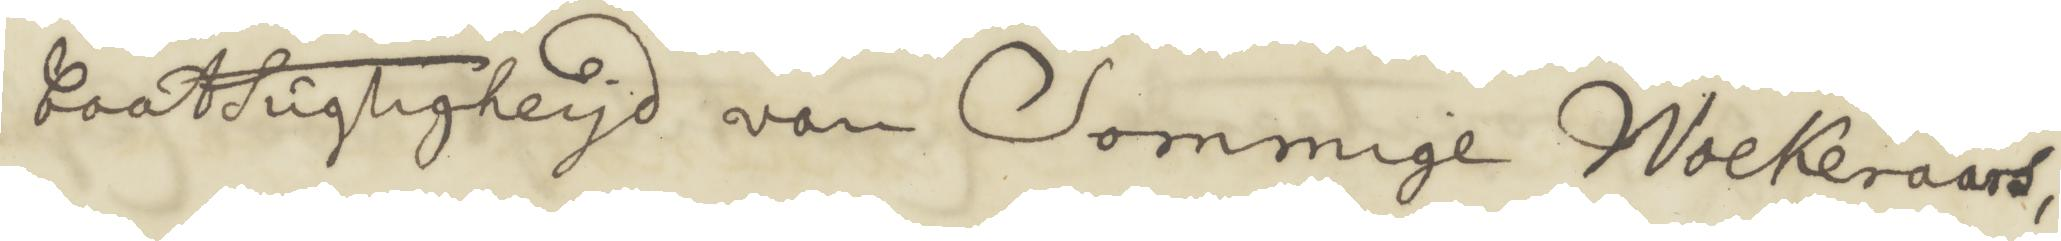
baatsugtigheijd van Sommige Woekeraars,
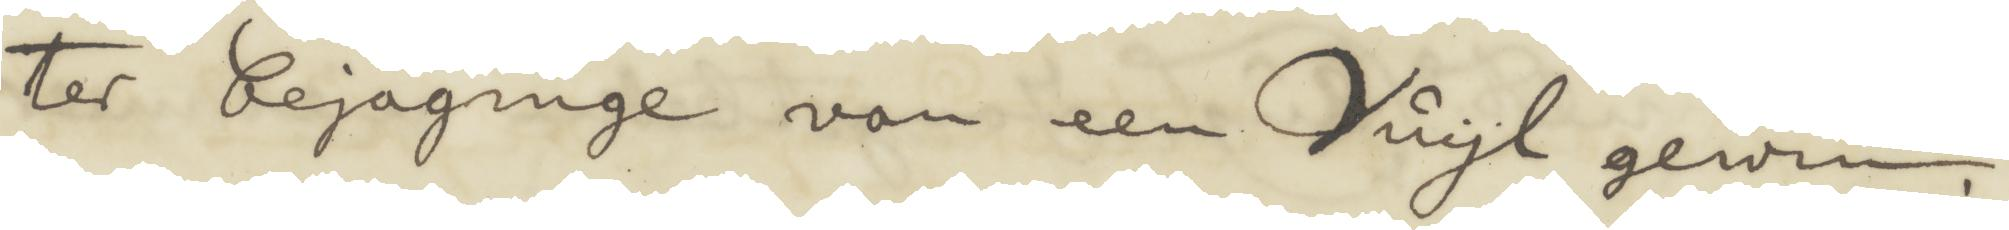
ter bejaginge van een Vuijl gewin.
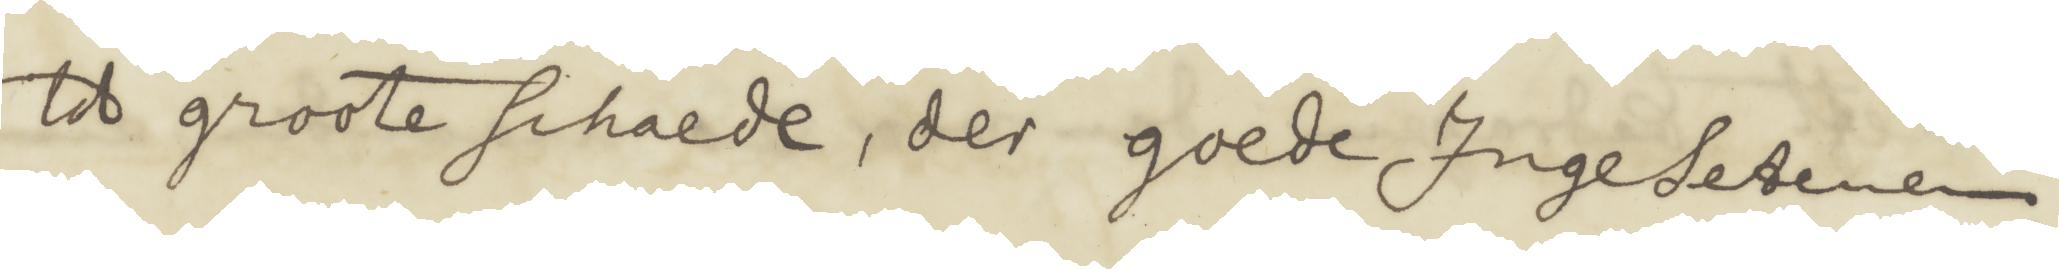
tot groote schaede, der goede Jngesetenen,
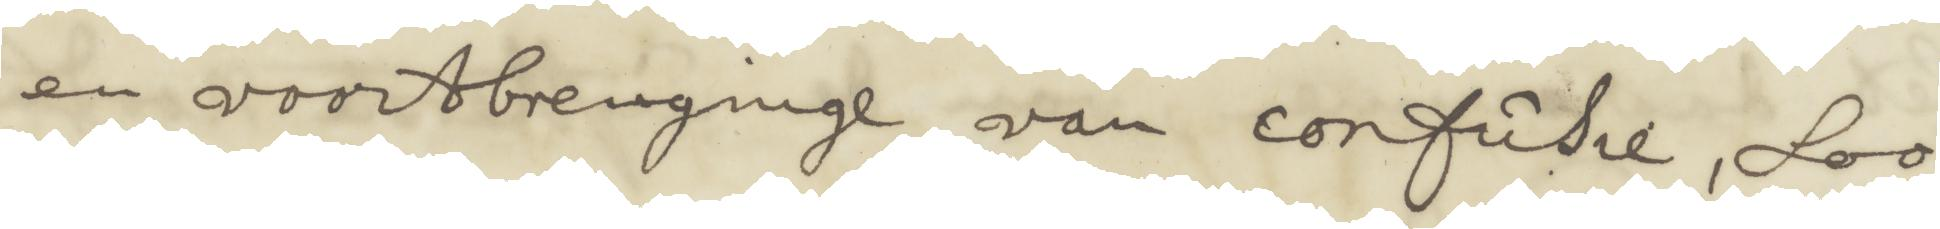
en voortbrenginge van confusie, soo
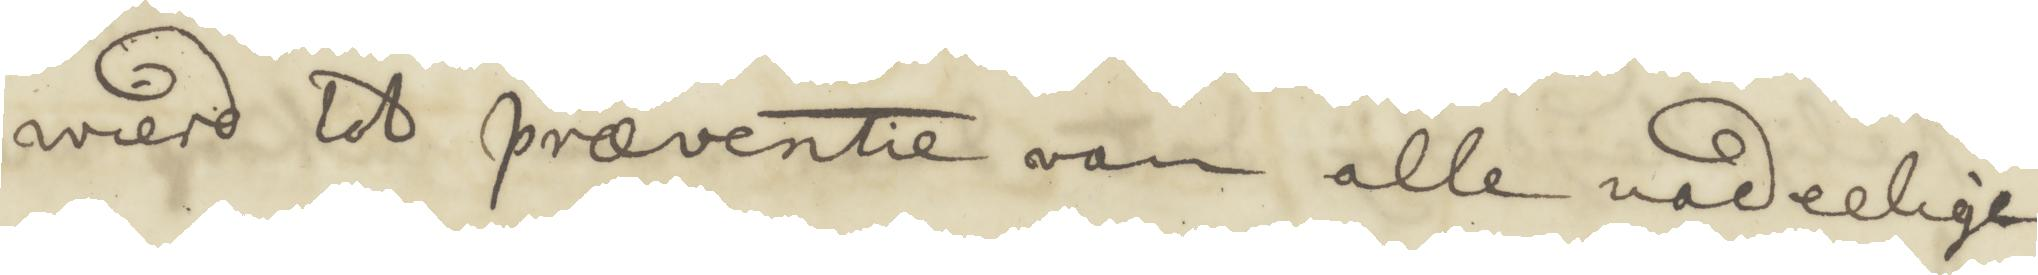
wierd tot praeventie van alle nadeelige
